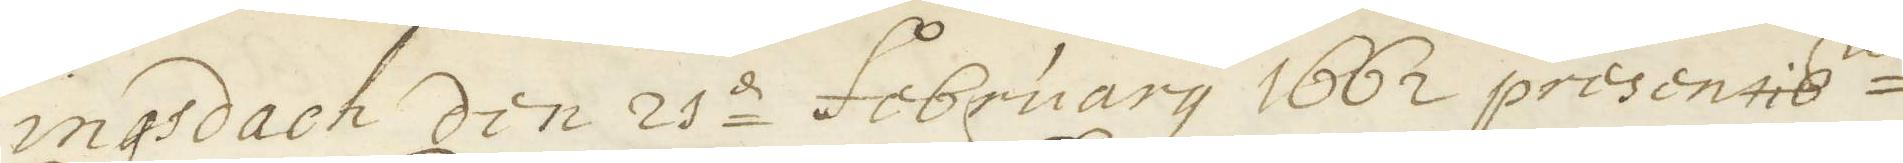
Dingsdach den 21=e Februarij 1662 presentib=s
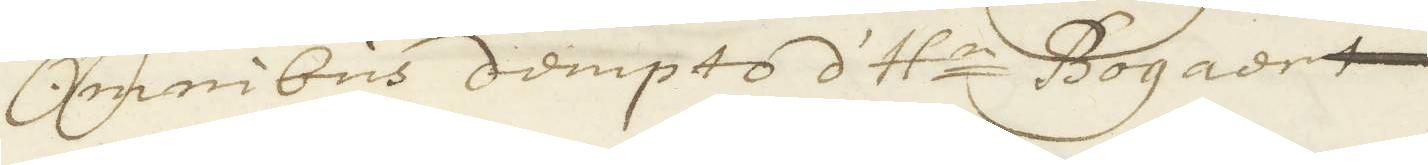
Omnibus dempto d’H=r Bogaert
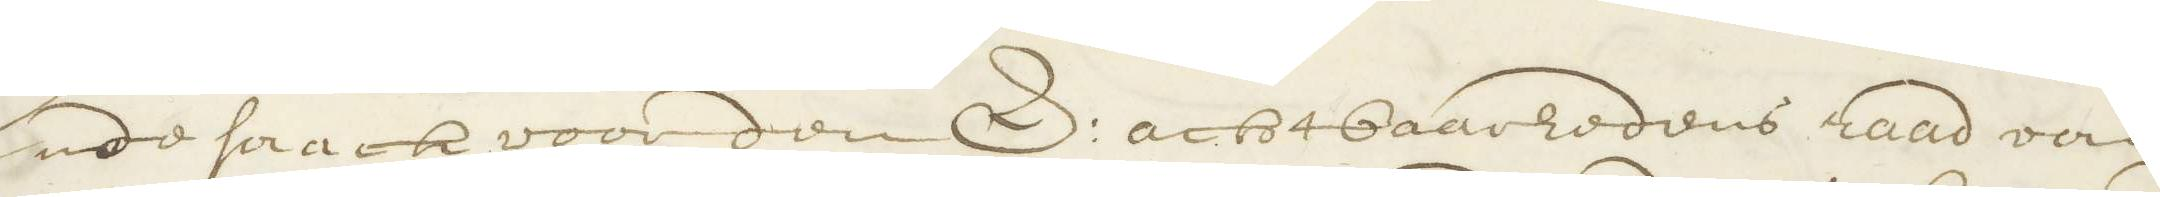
Jnde saack voor den E: achtbaarhedens raad van
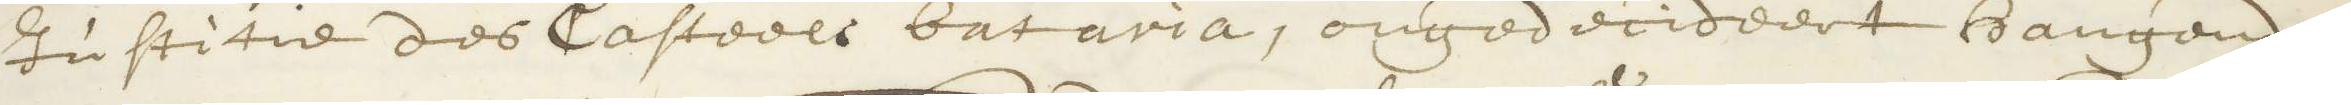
Justitie des Casteels batavia, ongedecideert hangende
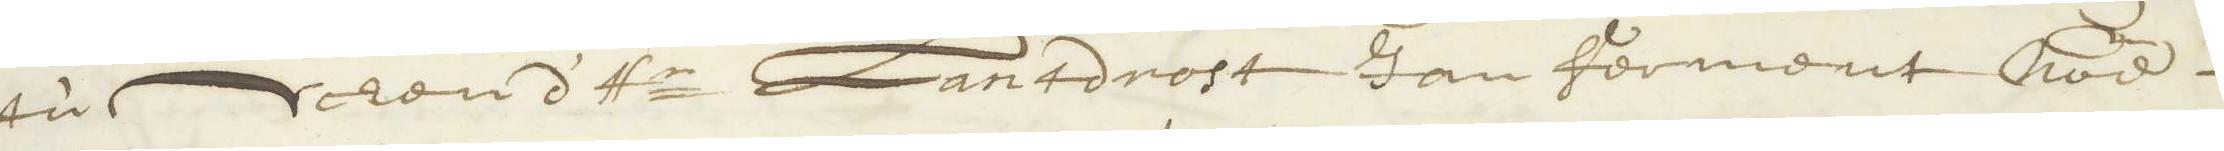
tusschen d’ H=r Lantdrost Ian ferment noe
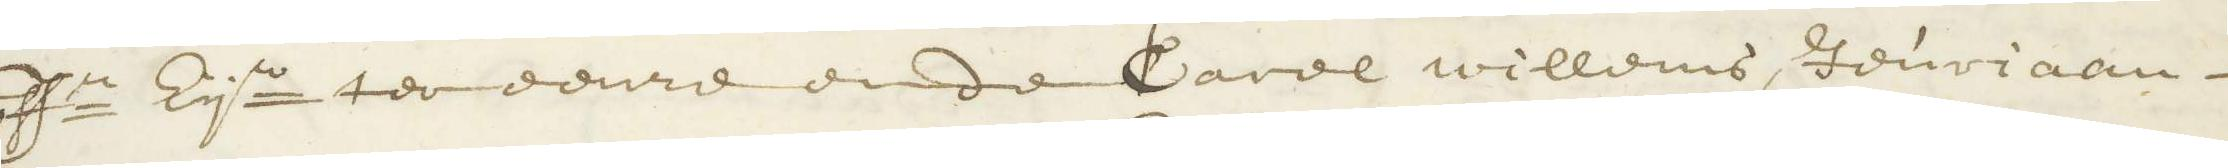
off=r Eij=r ter eenre ende Carel willems, Ieuriaan
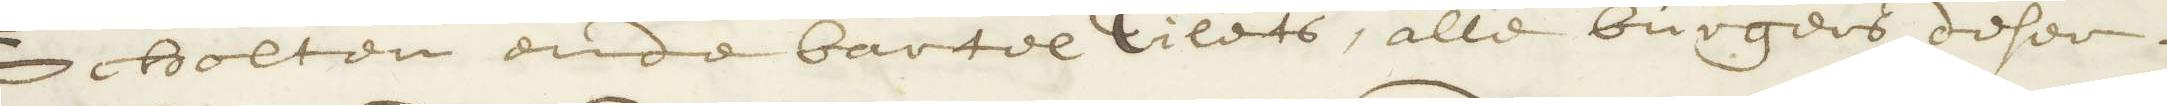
Scholten ende bartel Tilets, alle burgers deser
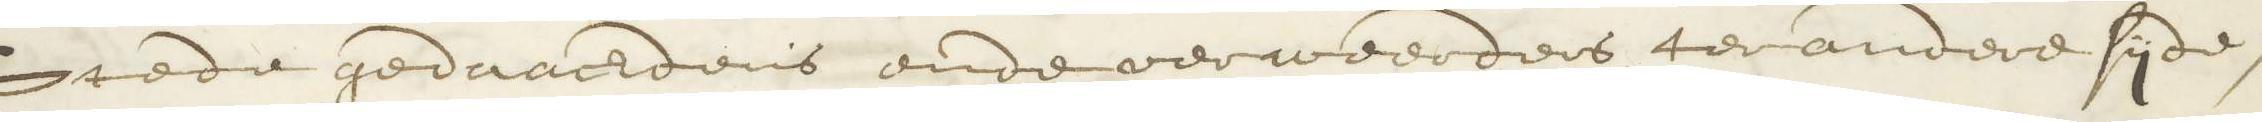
Stede gedaachdens ende verweerders ter andere sijde,
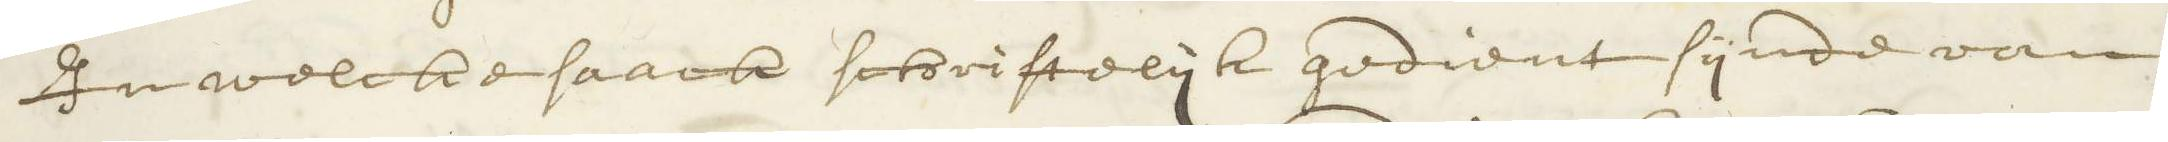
In welcke saack schriftelijk gedient sijnde van
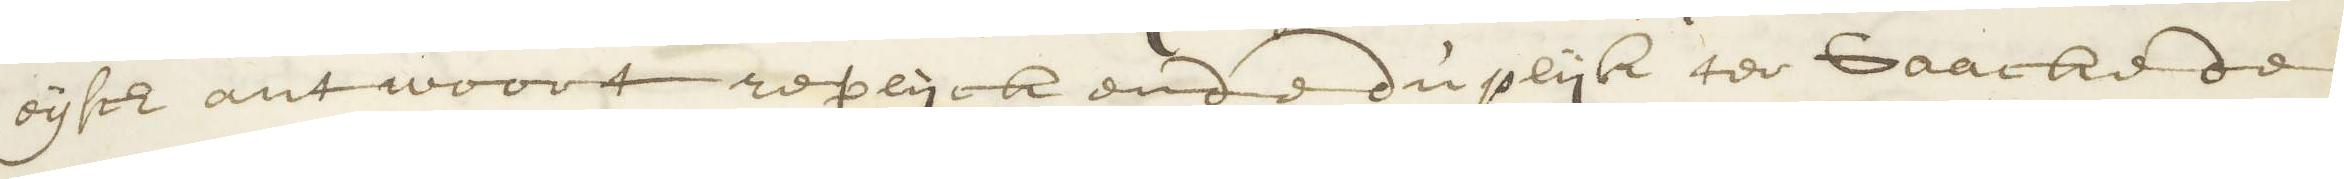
eijsch antwoort replijck ende duplijk ter saacke de
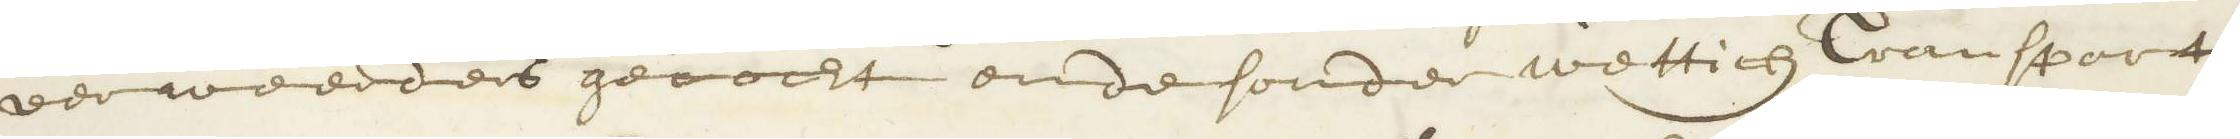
verweerders gecocht oude sonder wettich Transport
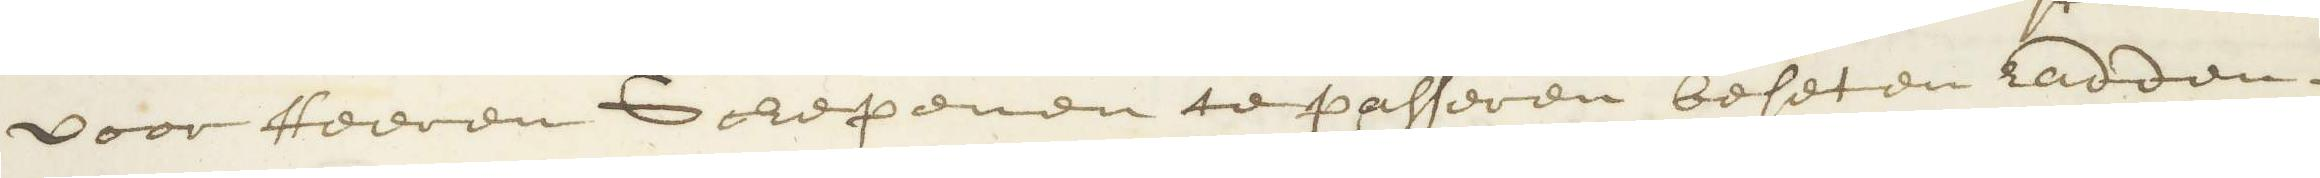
voor Heeren schepenen te passeren beseten hadden
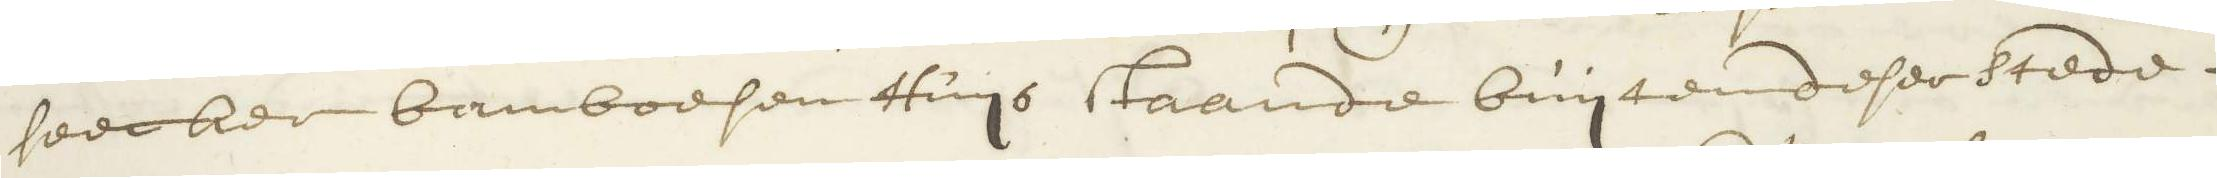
seecker bamboesen Huijs staande buijten deser stede
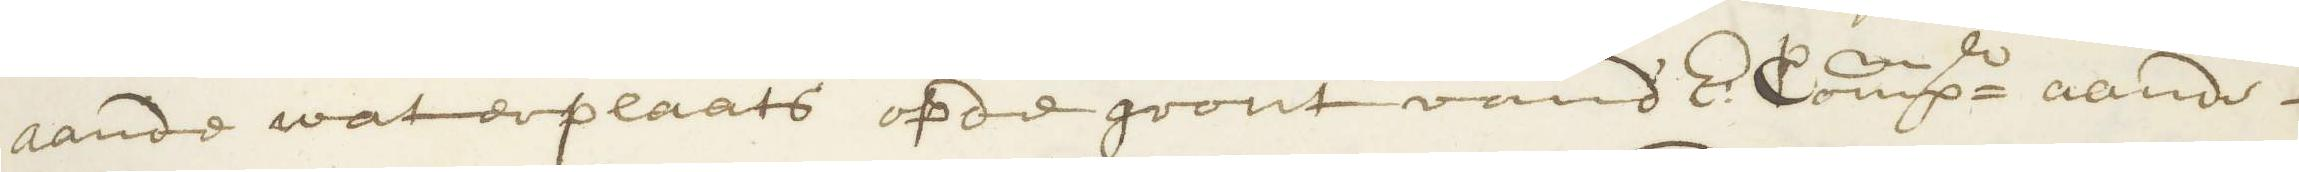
aande wat er plaats op de gront van d’ E: Comp=e aande
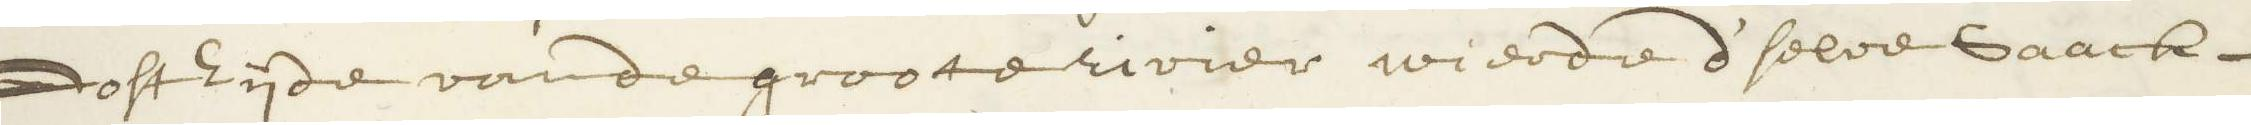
Oostzijde van de groote rivier wierde d’selve saack
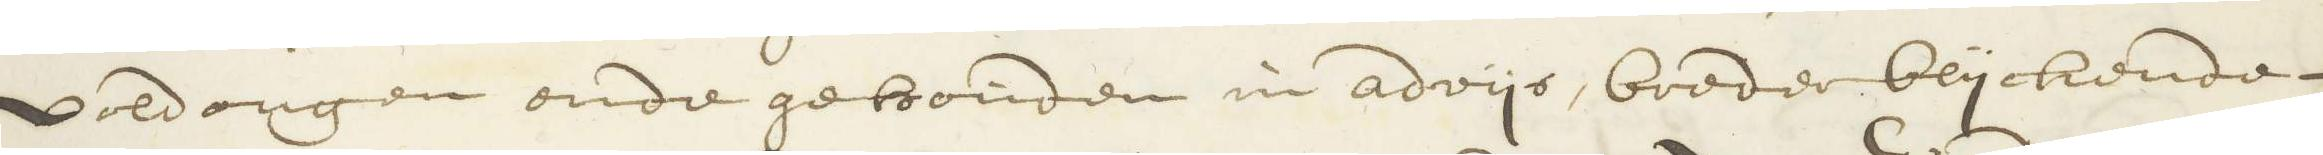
voldongen ende gehouden in advijs, breder blijckende
